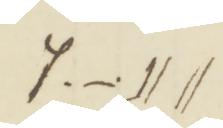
7.—. „ „
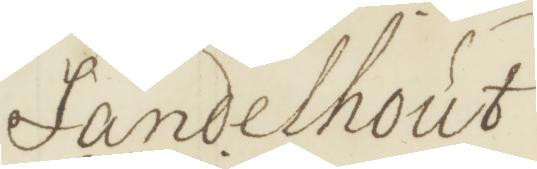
Sandelhout
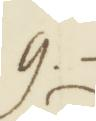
47. 9—
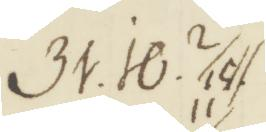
31.10. 2/15
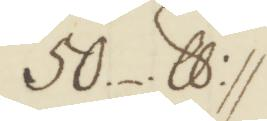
50.–. lb : „
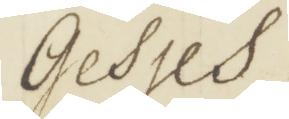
gesjes
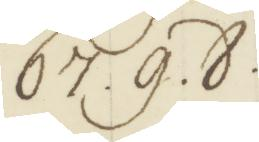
67.9.8
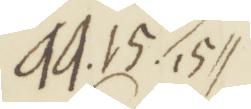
44.15. 11/15 „
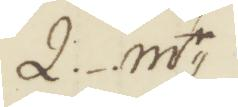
2.– m:r „
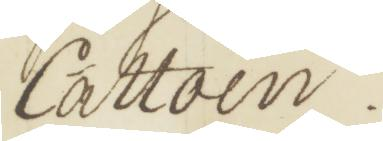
Cattoen.
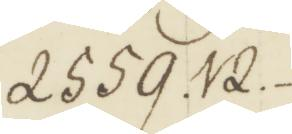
2559: 12.-
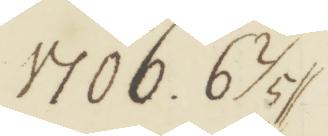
1706.6 2/5 „
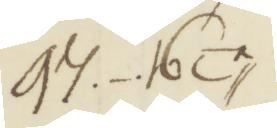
47.-6 c:r „
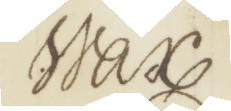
Wax
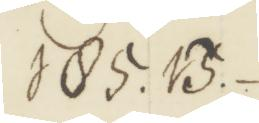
185:13:—
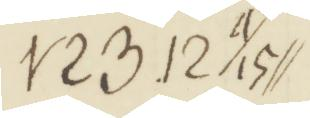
123.12 4/15 „
